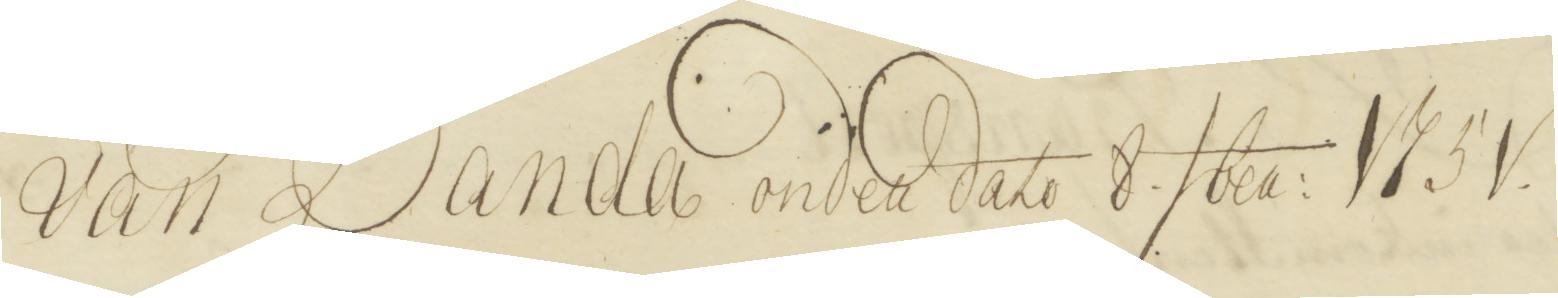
Van Banda onder dato 8. Jber: 1751.
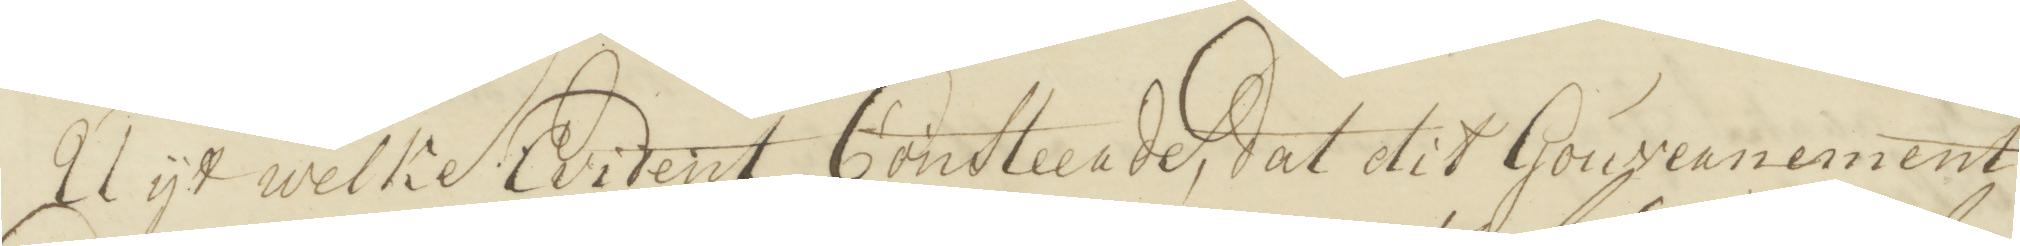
Uijt welke Evident Consteerde, dat dit Gouvernement
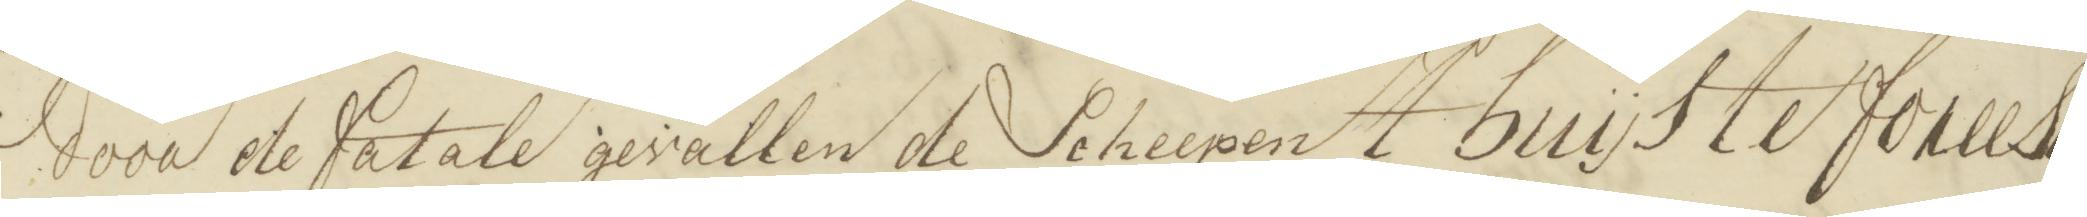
door de fatale gevallen de scheepen ’t huijs te foreest
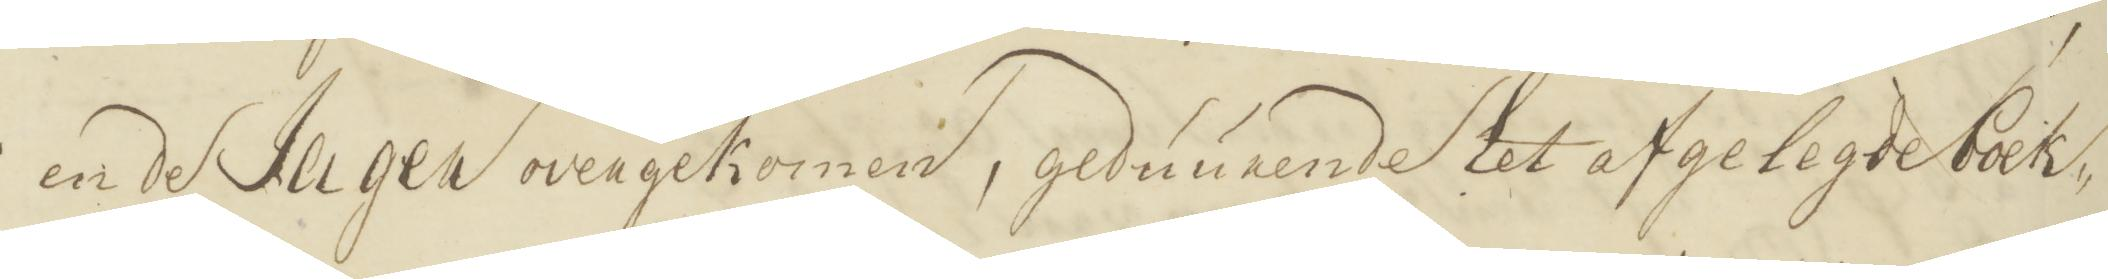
en de Iager overgekomen, geduurende het afgelegde boek„
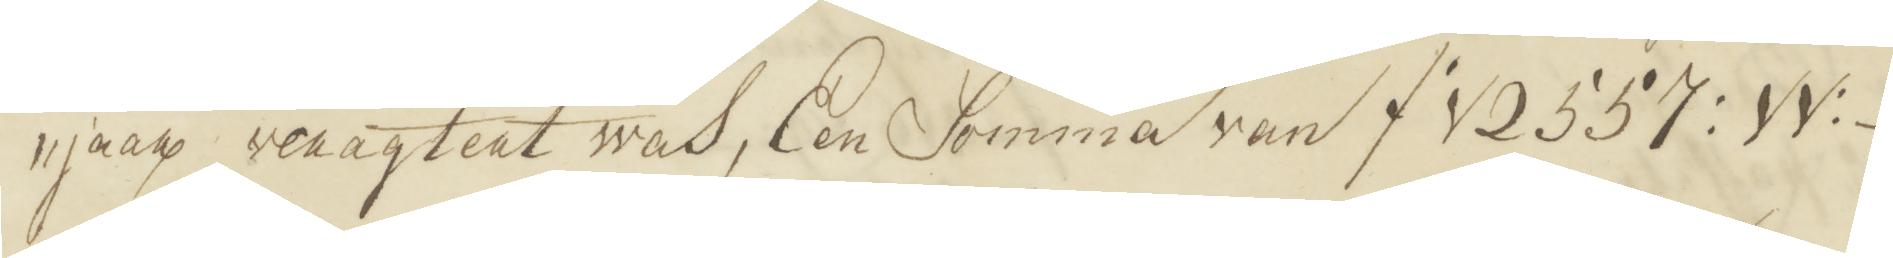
„jaar veragtert was, Een somma van ƒ 12557: 11:—
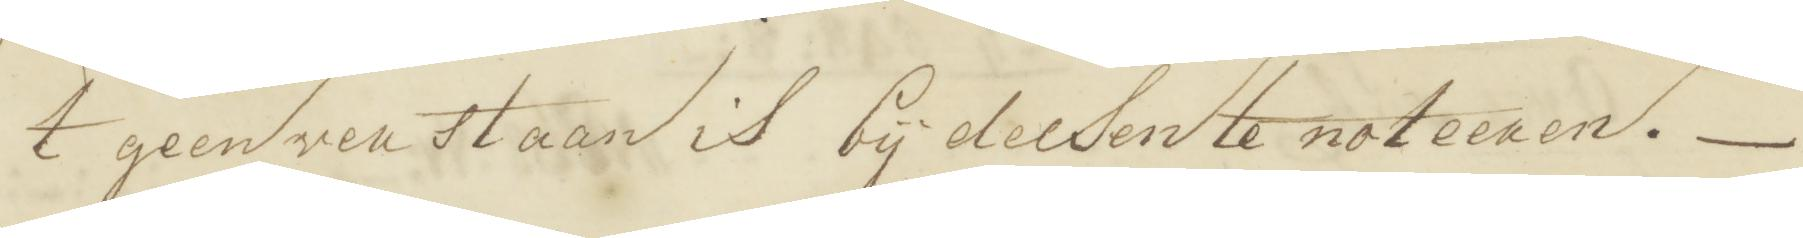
’t geen verstaan is bij deesen te noteeren. -
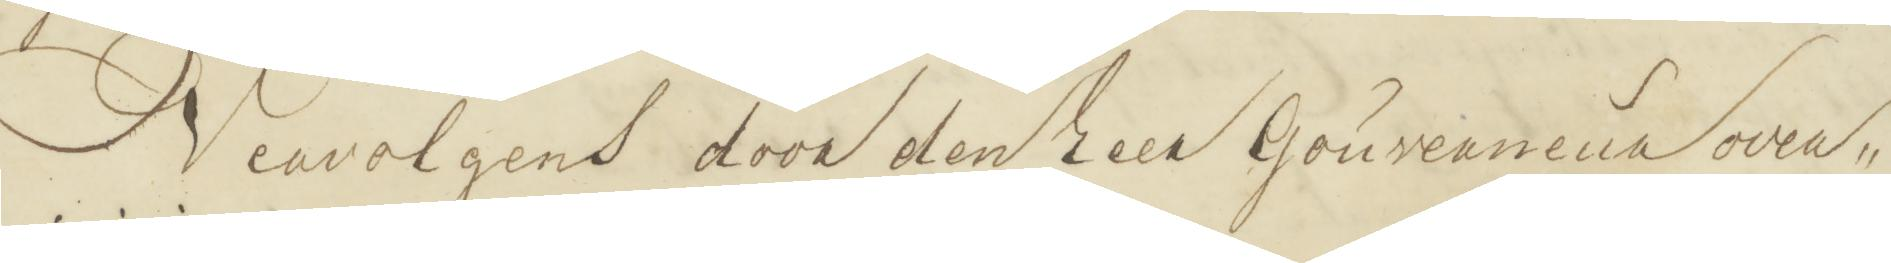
Vervolgens door den heer Gouverneur over„
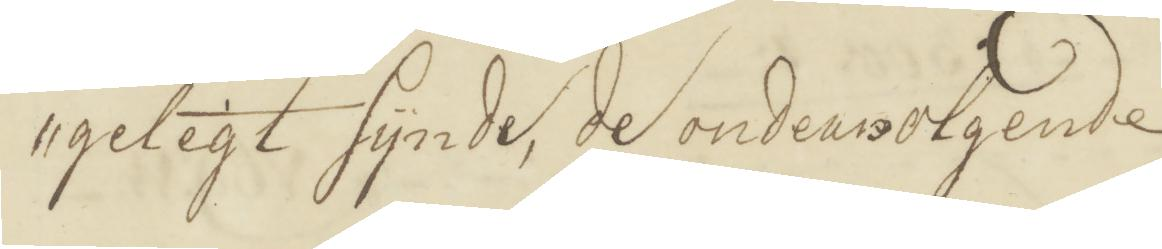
„gelegt sijnde, de ondervolgende
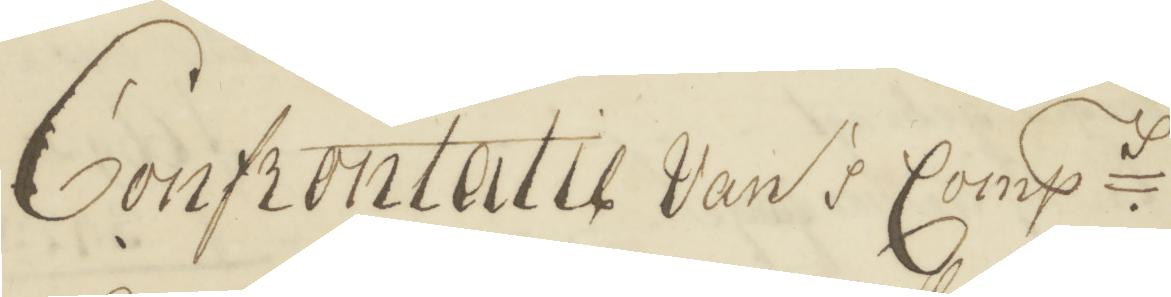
Confrontatie van ’s Comp=s.
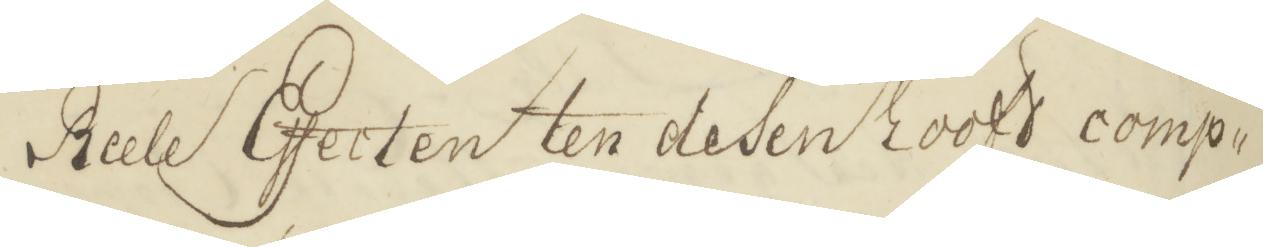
Reele Effecten ten desen hoofd comp„
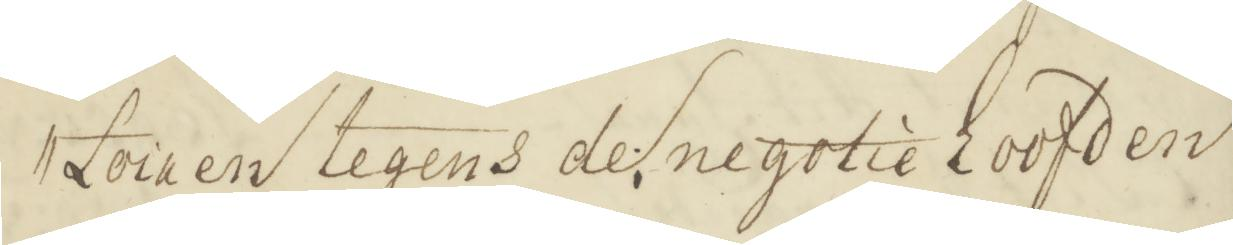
„toiren tegens de negotie hoofden
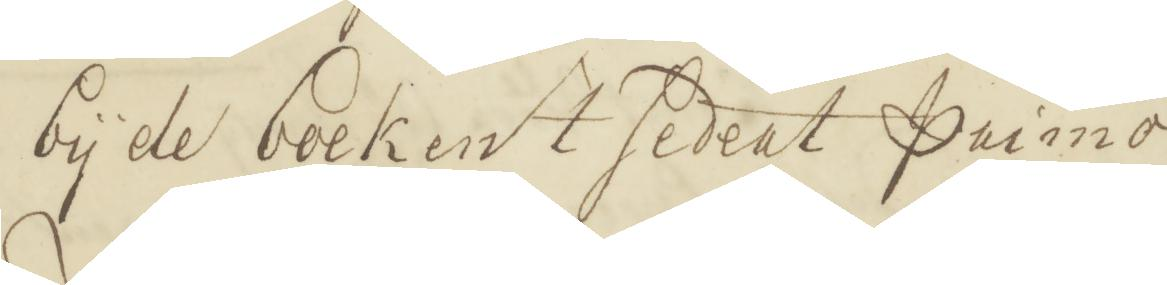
bij de boeken ’t sedert primo
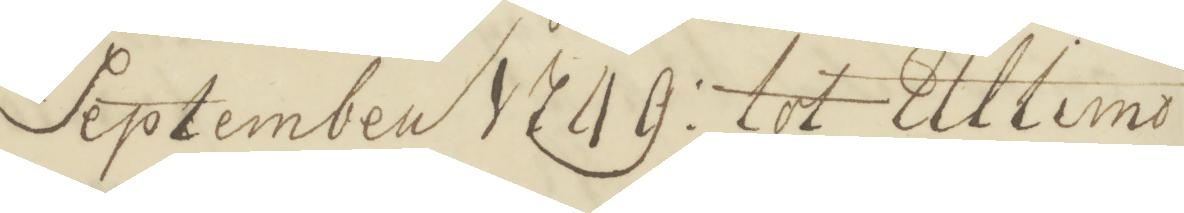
September 1749: tot Ultimo
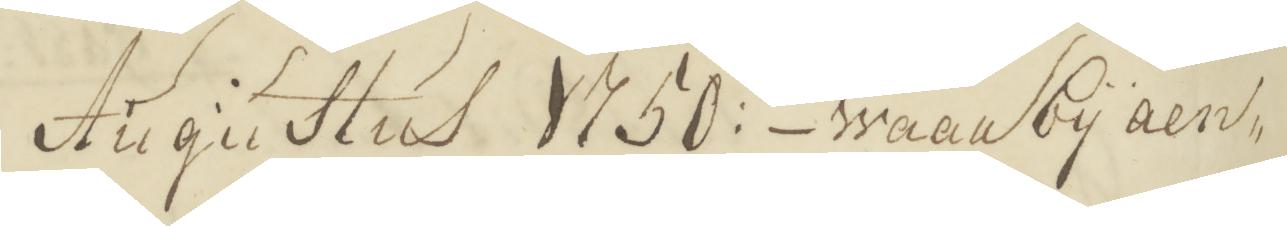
Augustus 1750: -waar bij aen„
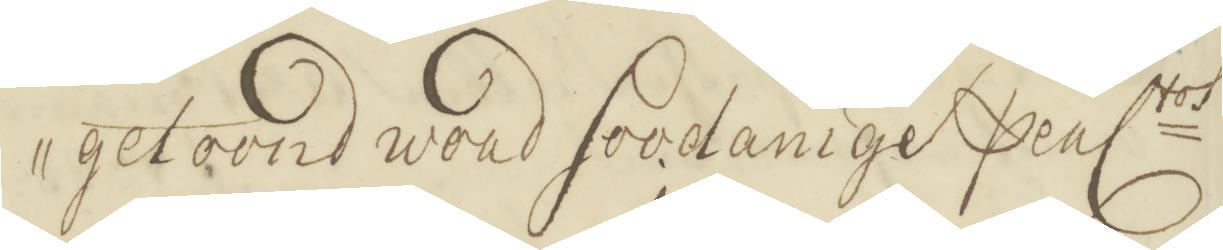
„getoond word soodanige perc=tos
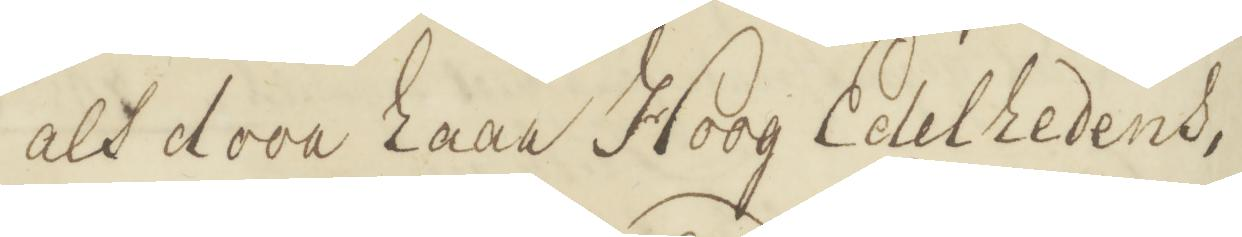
als door haar Hoog Edelhedens,
